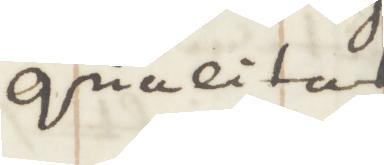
qualiti
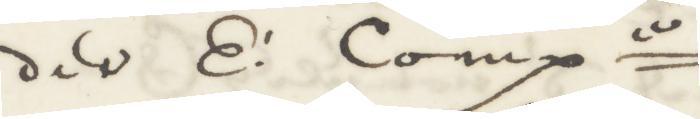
der E: Comp=e
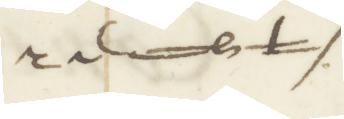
recht/
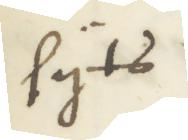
sijts
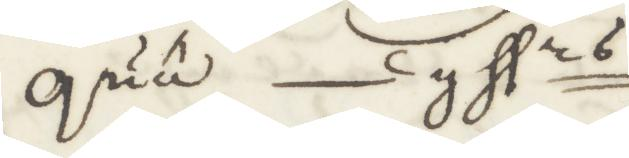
qua eijss=rs
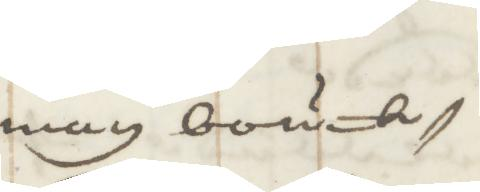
man bouck„
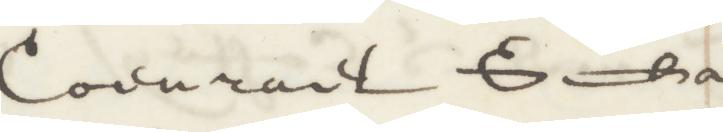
Coenraet Scha
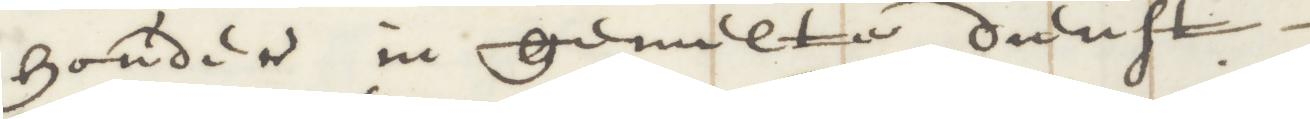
houder in gemelte dienst
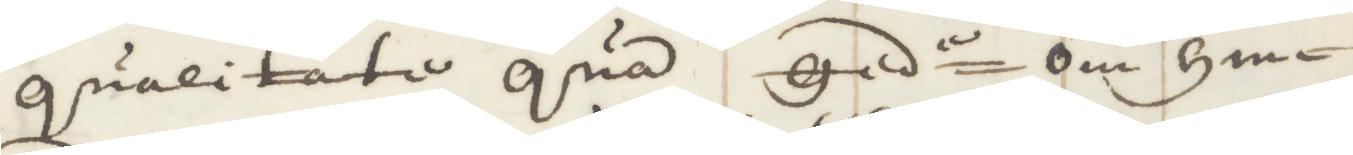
qualitate qua ged=e om hinc
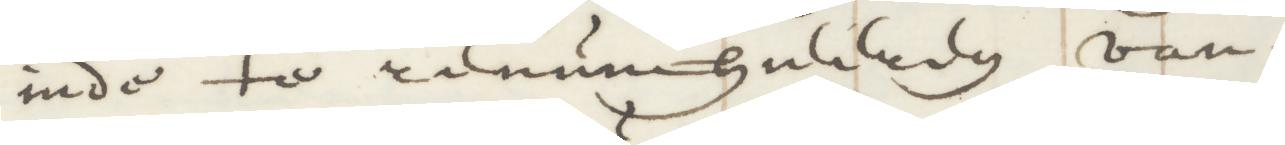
inde te renunchieeren van
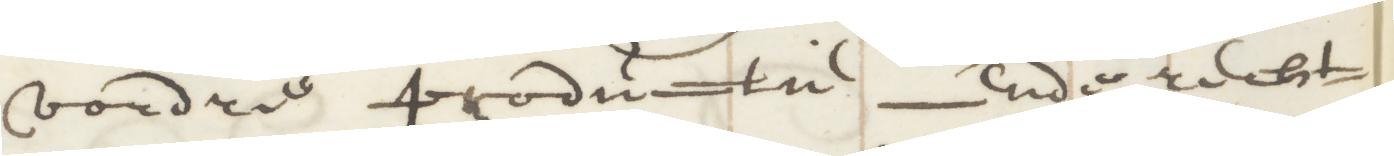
vordre productie ende rech-t
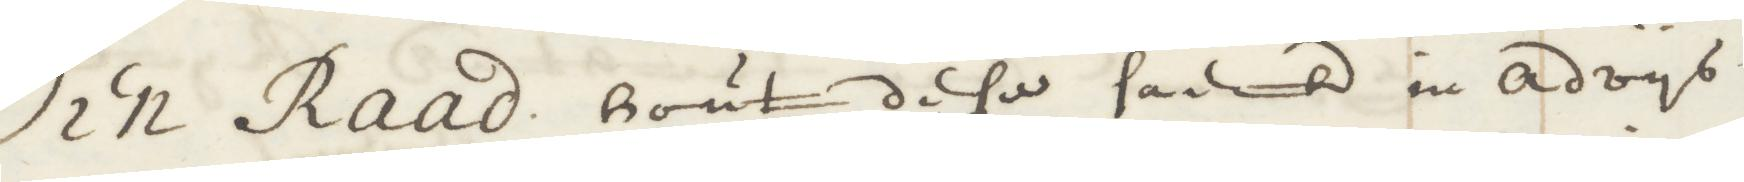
Den Raad hout dese saeck in advijs
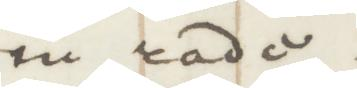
in rade
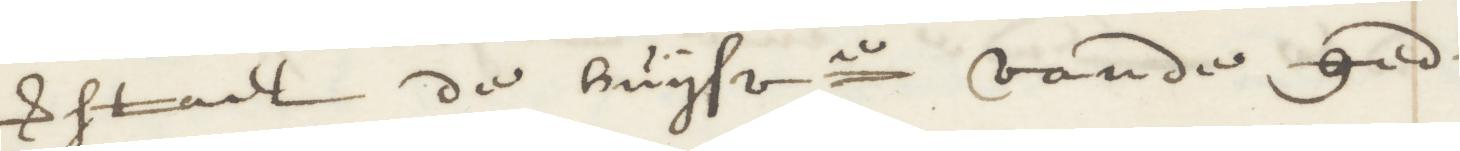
verstaet de huijsv=w van de ged
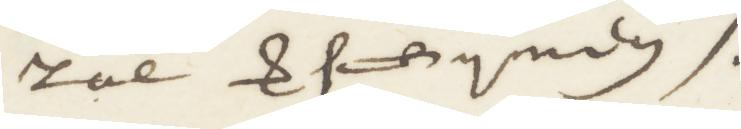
zal verschijnen/.
